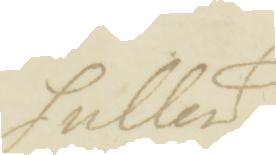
Sullen
